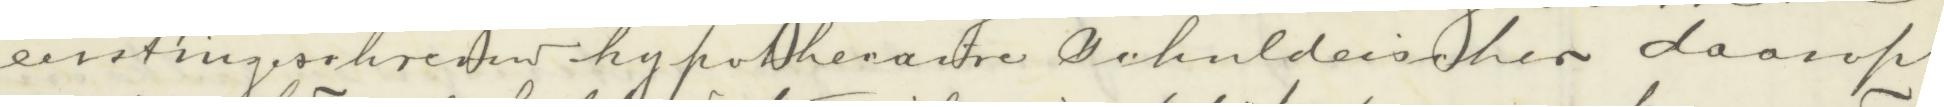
eerstingeschreven hypothecaire schuldeischer daarop
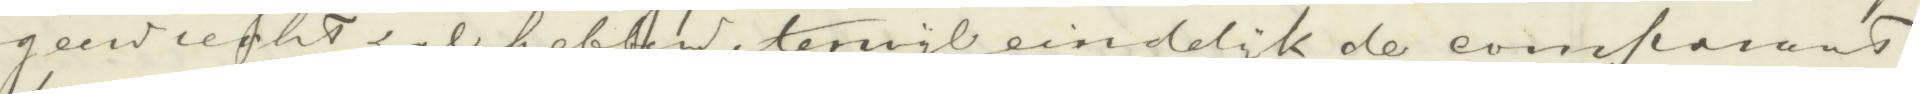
geen recht zal hebben, terwijl eindelijk de comparant
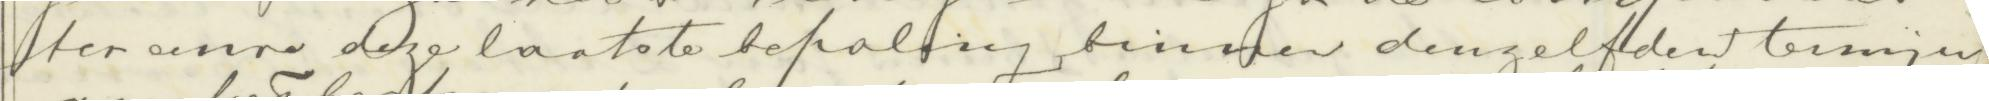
ter eeenre deze laatste bepaling binnen denzelfden termijn
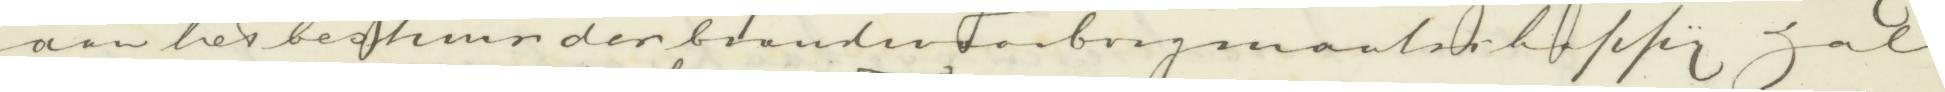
aan het bestuur der brandwaarborgmaatschappij zal
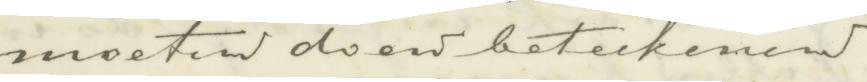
moeten doen beteekenen
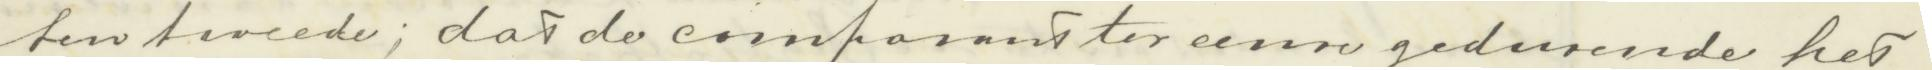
ten tweede; dat de comparant ter eenre gedurende het
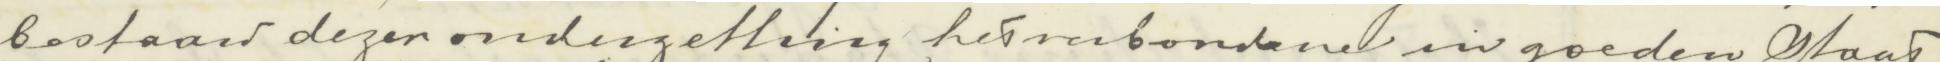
bestaan deser onderzetting het verbondene in goeden staat
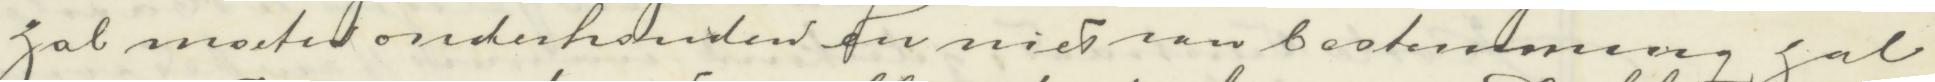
zal moeten onderhouden en niet van bestemming zal
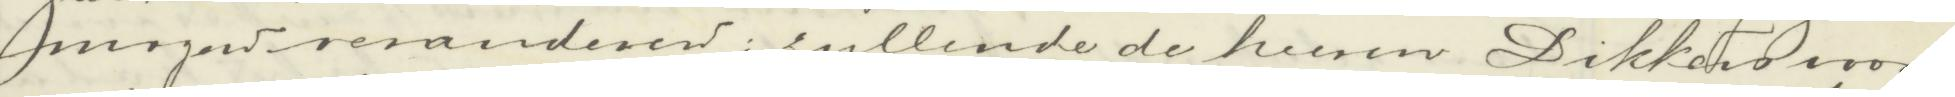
mogen veranderen; zullende de heeren Dikkers voor
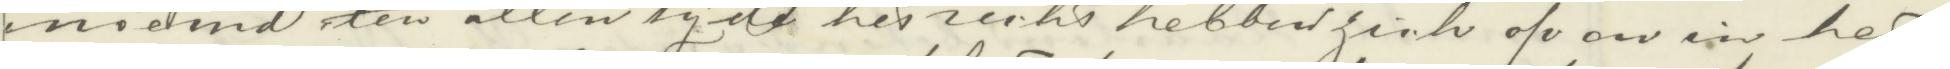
noemd, ten allen tijde het recht hebben zich op en in het
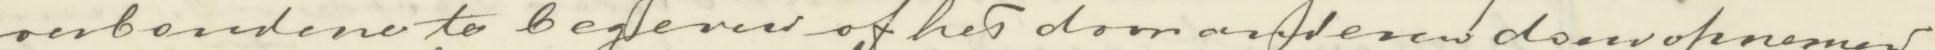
verbondene te begeven of het door anderen doen opnemen
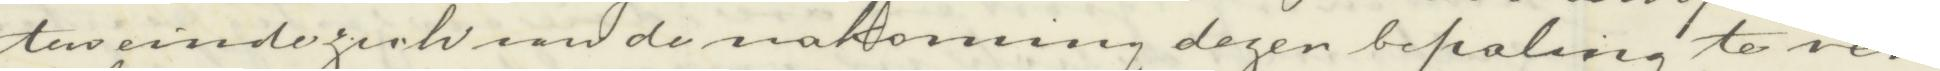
ten einde zich van de nakoming dezer bepaling te ver,
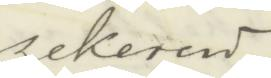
zekeren
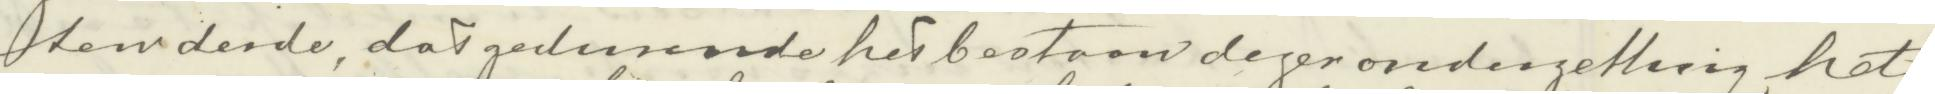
ten derde, dat gedurende het bestaan dezer onderzetting het
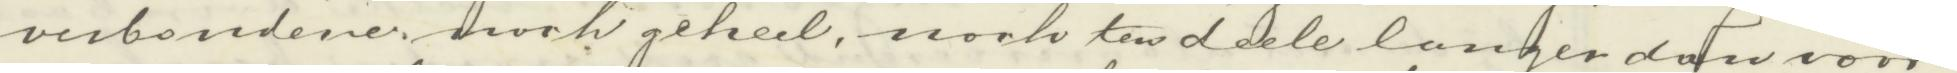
verbondene, noch geheel, noch ten deele langer dan voor
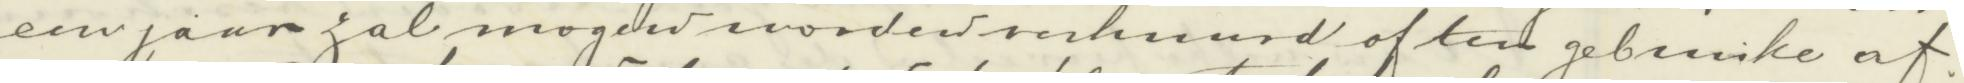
een jaar zal mogen worden verhuurd of ten gebruike af„
